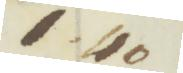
1. 40
